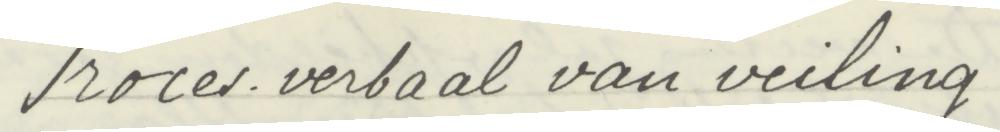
Proces - verbaal van veiling
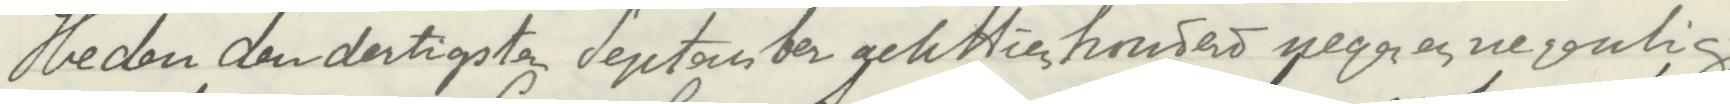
Heden den dertigsten September achttien honderd negen en negentig
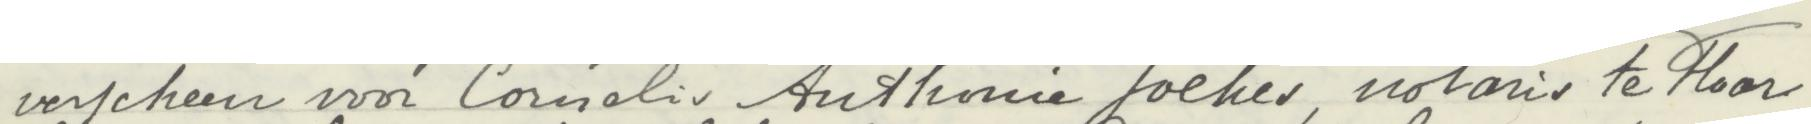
verscheen voor Cornelis Authonie Joekes notaris te Haar
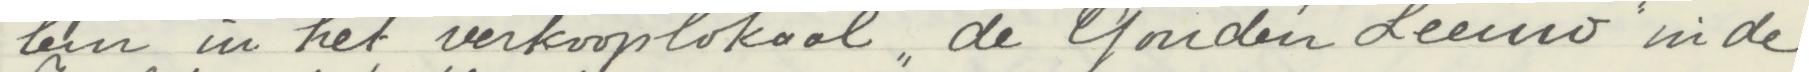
lem in het verkooplokaal „ de Gouden Leeuw " in de
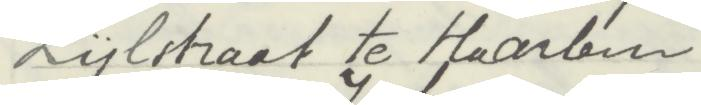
Zijlstraat te Haarlem
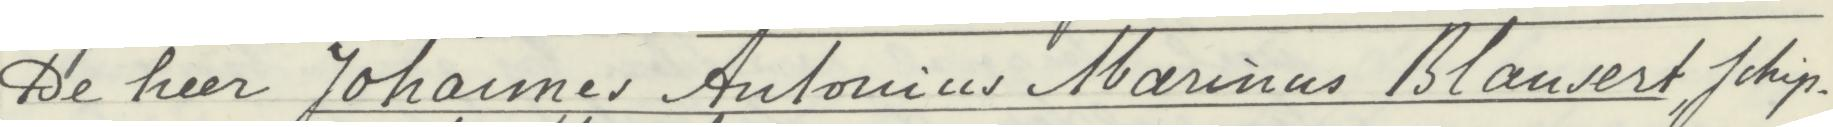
De heer Johannes Antonius Marinus Blansert, schip
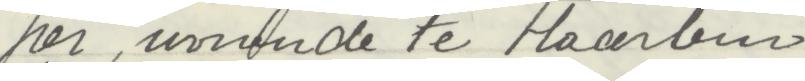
per, wonende te Haarlem
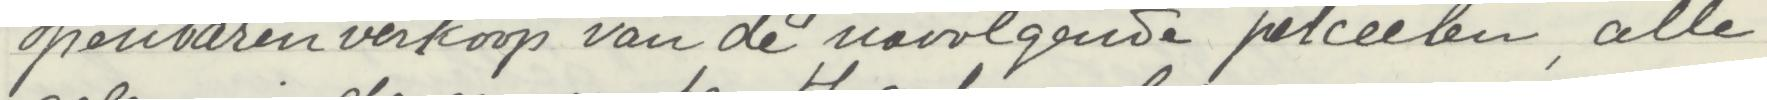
openbaren verkoop van de navolgende perceelen, alle
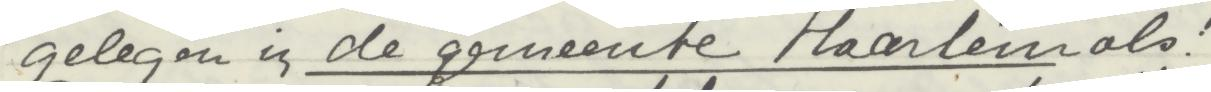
gelegen in de gemeente Haarlem als:
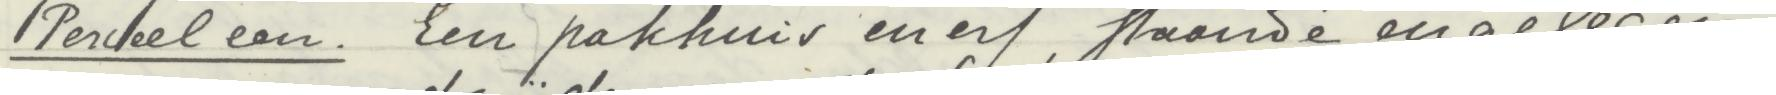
Perceel een. Een pakhuis en erf staande en gelegen
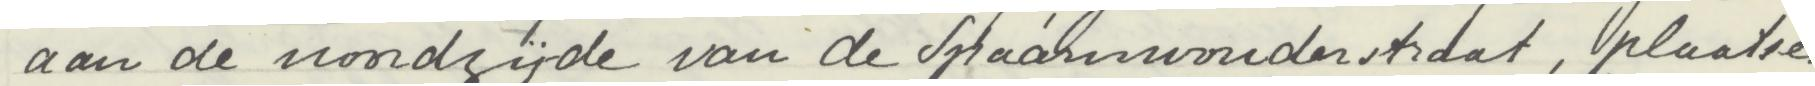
aan de noordzijde van de Spaarnwouderstraat, plaatse
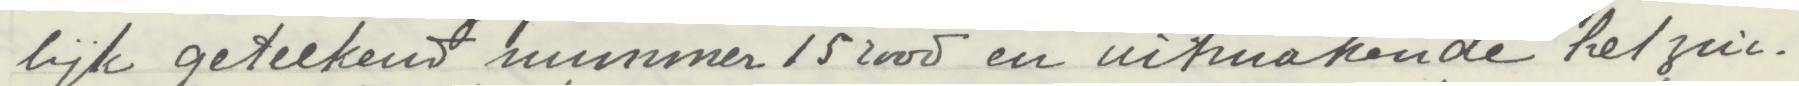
lijk geteekend nummer 15 rood en uitmakende het zui-
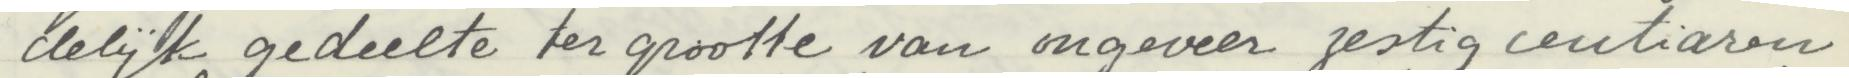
delijk gedeelte ter grootte van ongeveer zestig centiaren
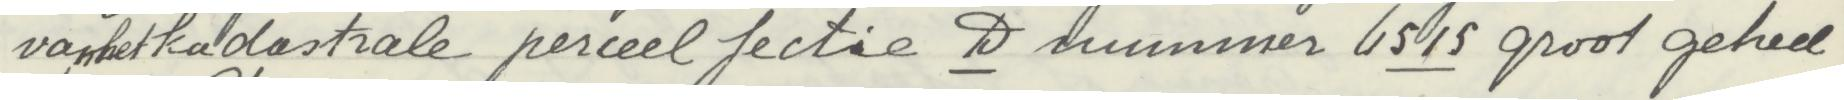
van het kadastrale perceel sectie D nummer 4515 groot geheel
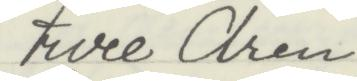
twee Aren
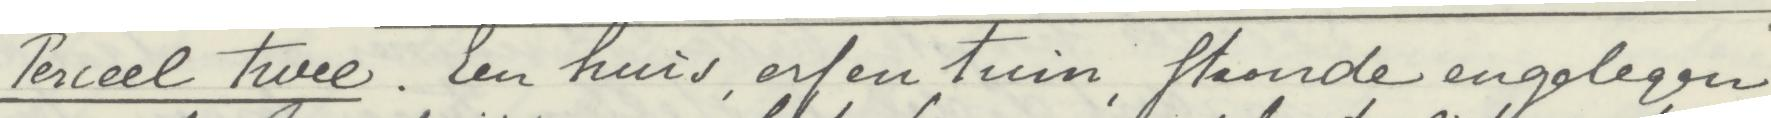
Perceel twee. Een huis, erf en tuin, staande en gelegen
